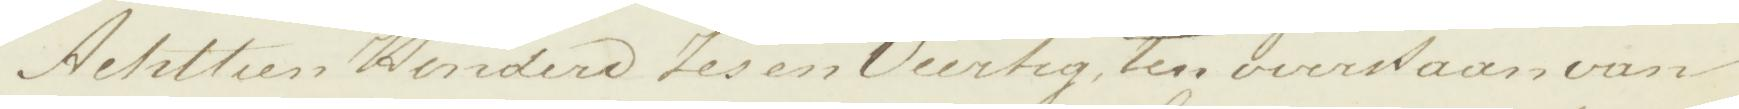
Achttien Honderd Zes en Veertig, ten overstaan van
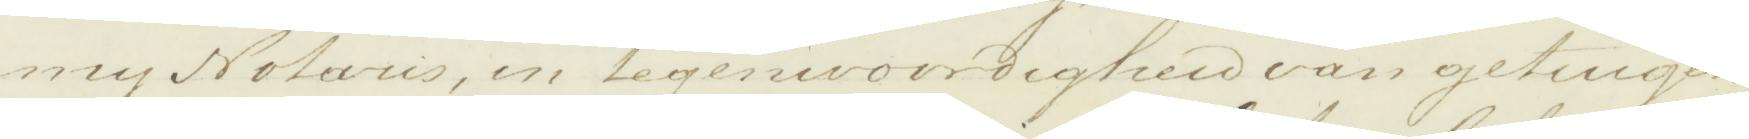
my Notaris, in tegenwoordigheid van getuigen
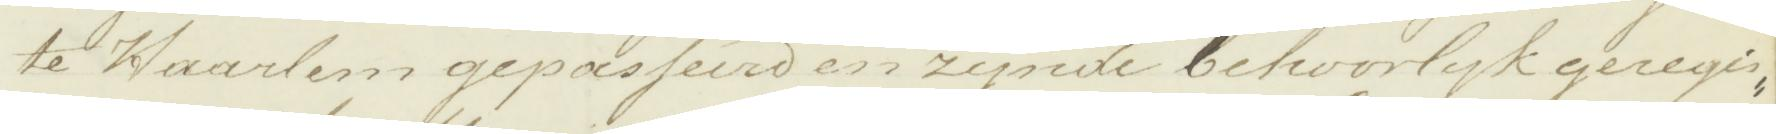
te Haarlem gepasseerd en zijnde behoorlyk geregis„
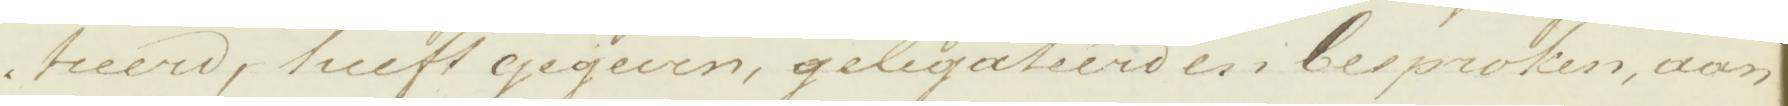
treerd, heeft gegeven, gelegateerd en besproken, aan
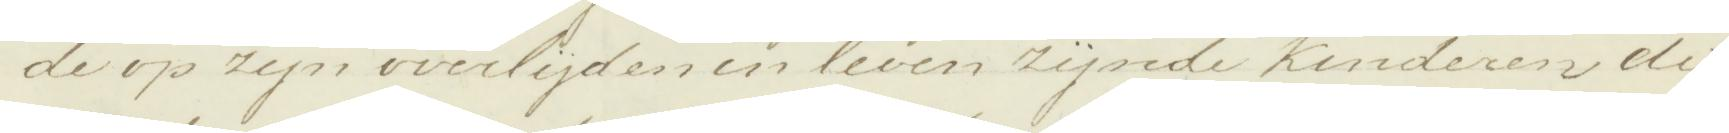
de op zyn overlijden in leven zijnde kinderen die
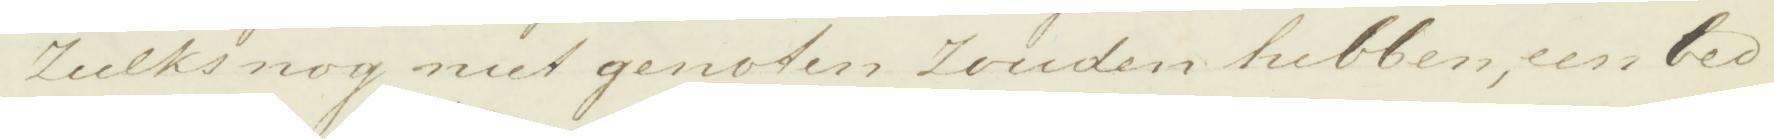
zulks nog niet genoten zouden hebben, een bed
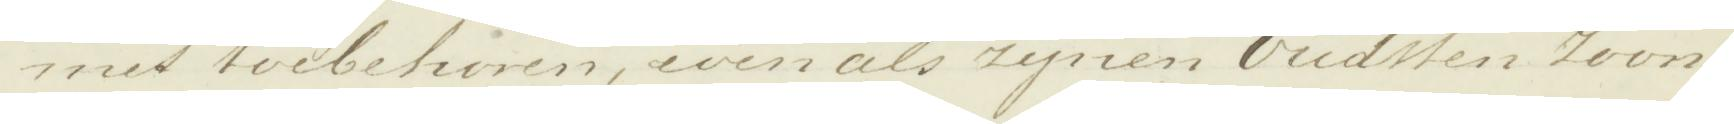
met toebehoren, even als zynen Oudsten zoon,
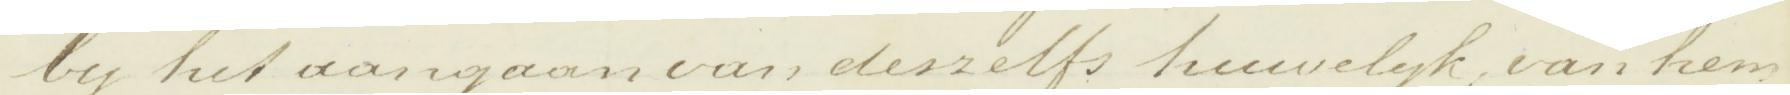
by het aangaan van deszelfs huwelyk, van hem
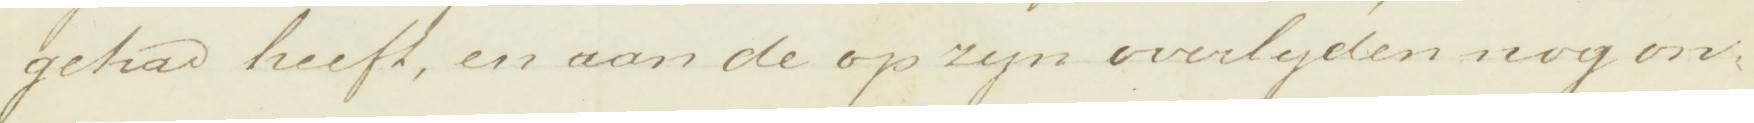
gehad heeft, en aan de op zyn overlyden nog on„
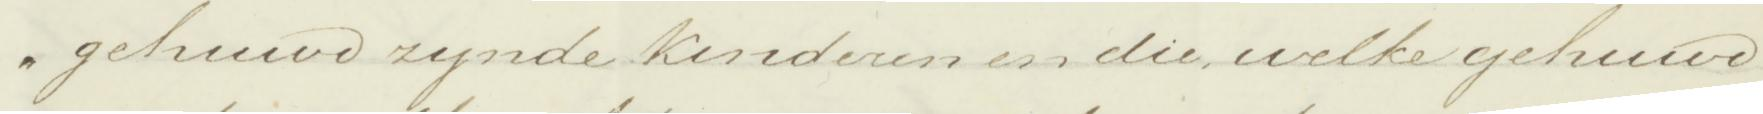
„gehuwd zynde kinderen en die, welke gehuwd
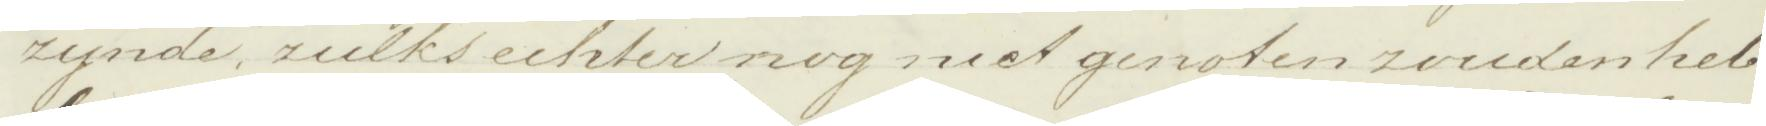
zynde, zulks echter nog niet genoten zouden heb
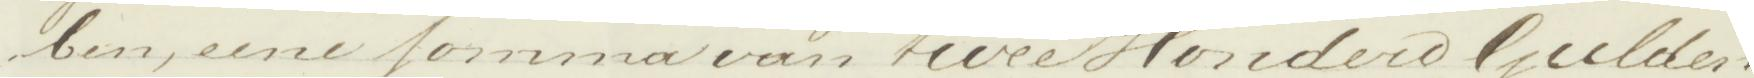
„ben, eene somma van twee Honderd Gulden
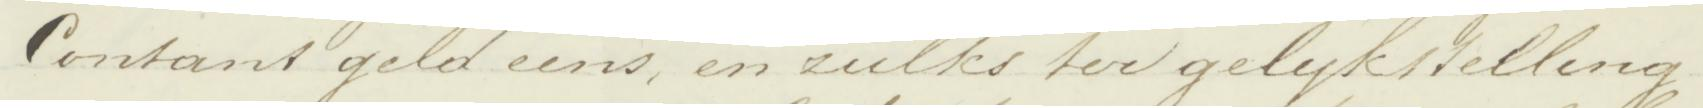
Contant geld eens, en zulks ter gelykstelling
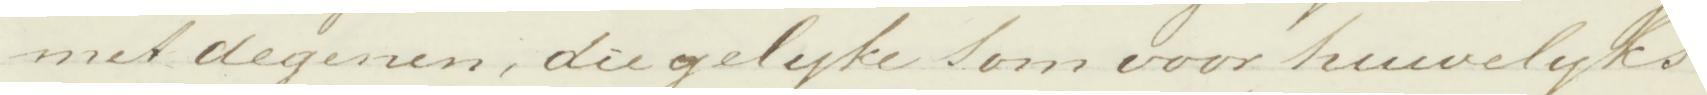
met degenen, die gelyke som voor huwelyks
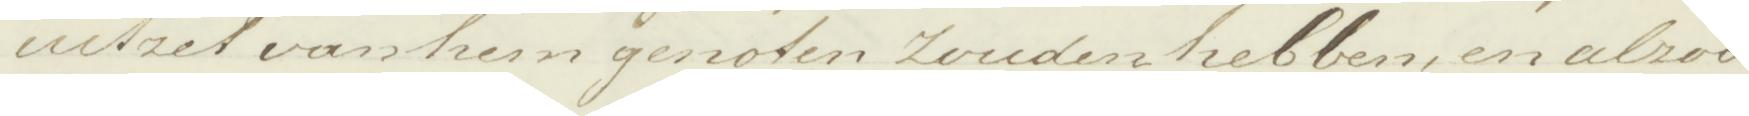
uitzet van hem genoten zouden hebben, en alzoo
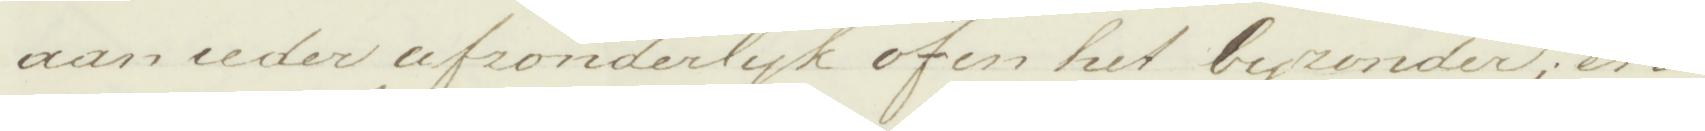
aan ieder afzonderlyk of in het byzonder; en
